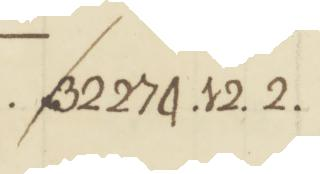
ƒ32274.12.2.
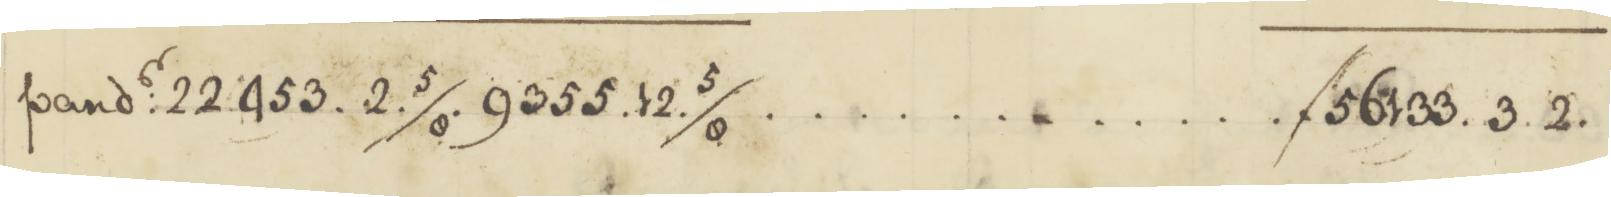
pard:s 22453.2.5/8. 9355:12.5/8 . . . . . . . .56133.3.2.
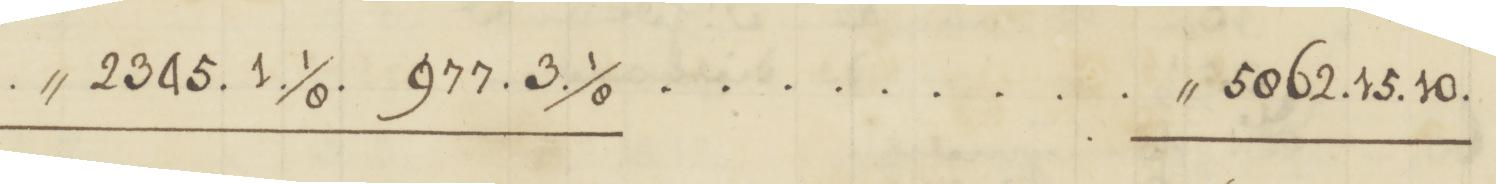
„ 2345.1.1/8. 977.3.1/8 . . . . . . . .. . . . . . . . „ 5862.15.10.
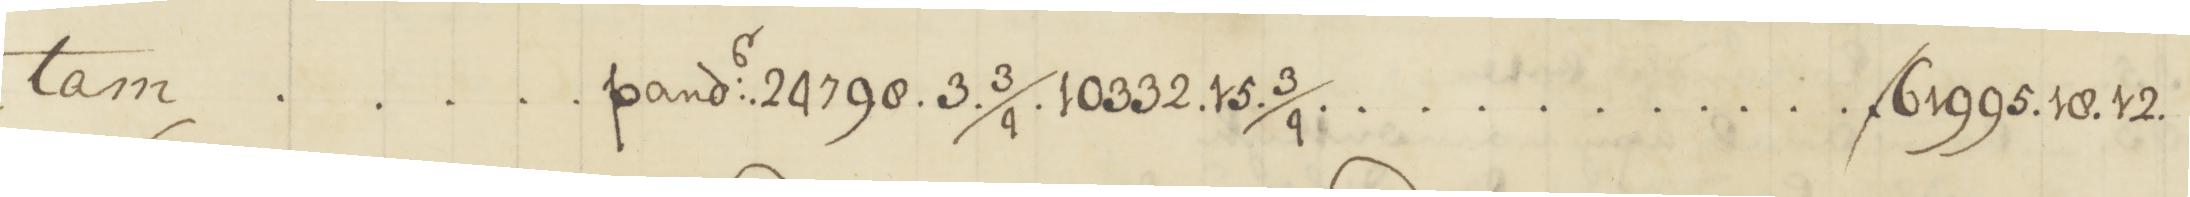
„tam pard:s.24798. 3.¾.10332.15.¾. . . . . .ƒ61995.18.12.
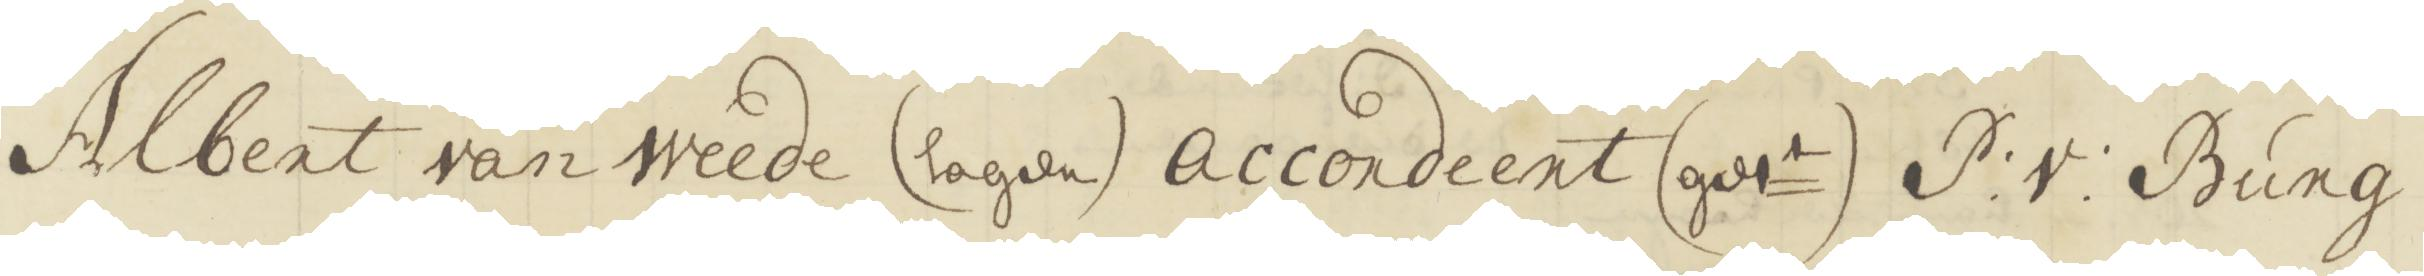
Albert van weede (lager) accordeert (get=t) P: v: Burg
